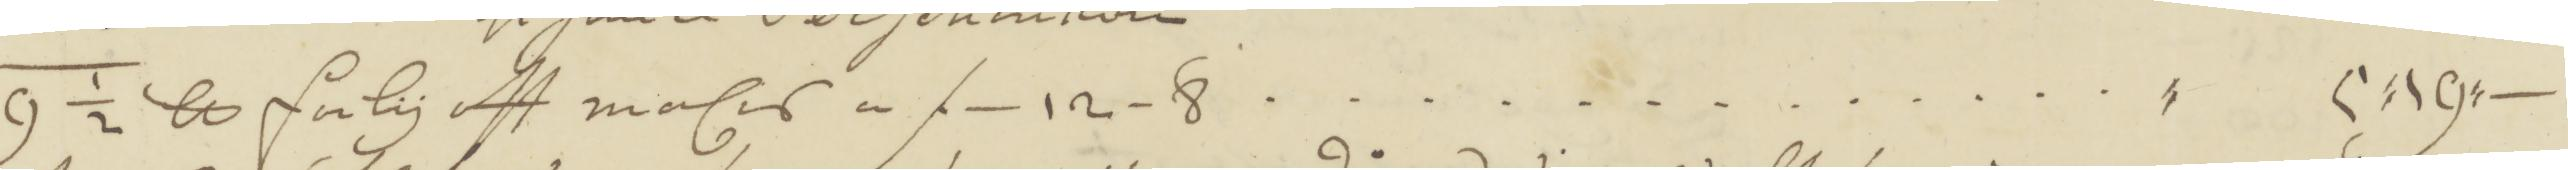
9½ lb foelij off macis en ƒ — 12– 8 . . . . . . . . . . . . . „ 5„19„—
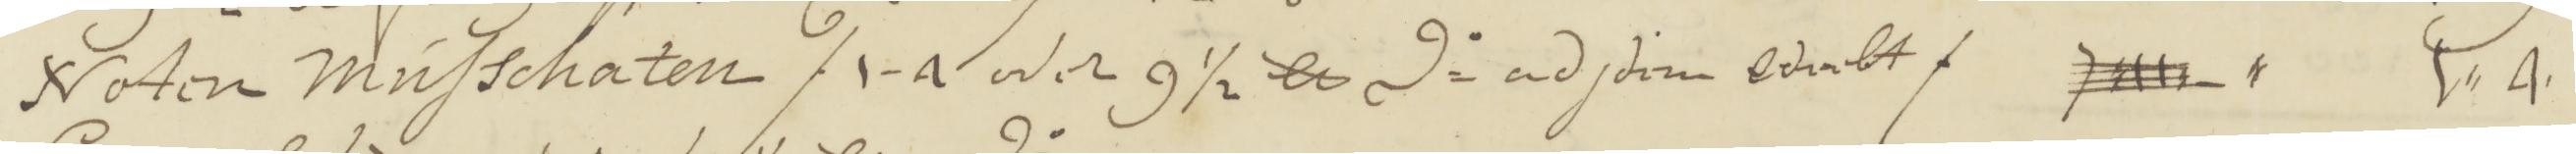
Noten Musschaten ƒ1-4 over 9½ lb d=o ad jdem betaalt ƒ 7„11„_ „ 1 „ 4,
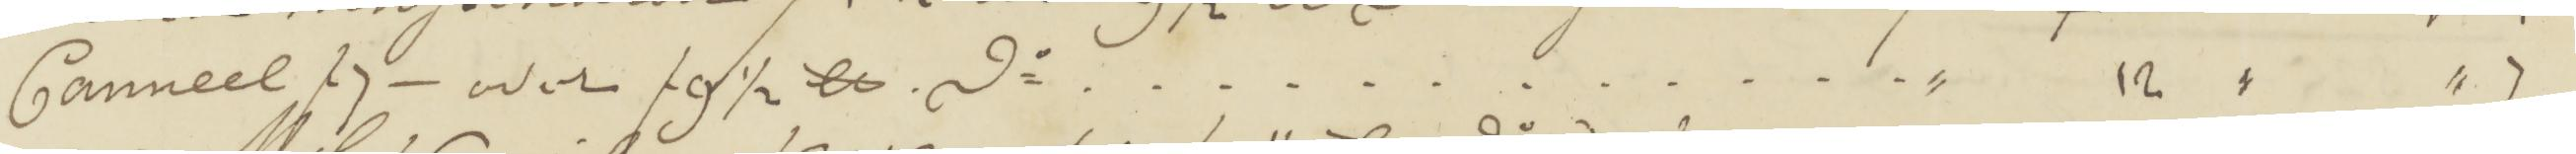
Canneel 27 - over f 9½ lb: d=o . . - - . . . . . . . . „ 12„ „ 7
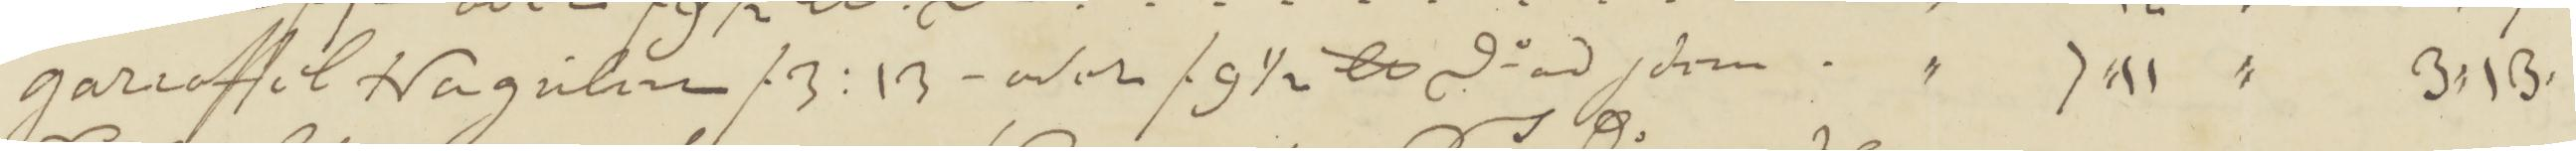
garioffel Nagulen ƒ3:13 - over ƒ9½ lb d-o ad jdem . „ 7„11 „ 3„13,
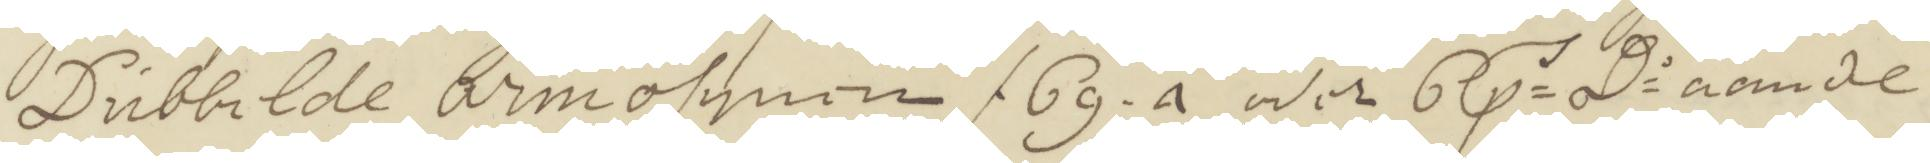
Dubbelde armosijnen ƒ69.4 over 6 p=s D=o aan de
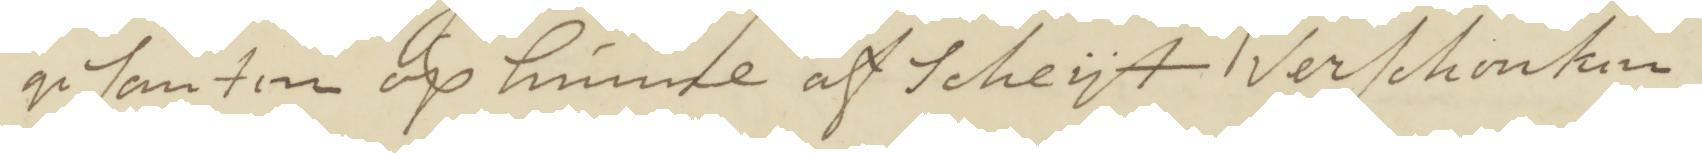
gesanten op hunne afscheijt verschonken
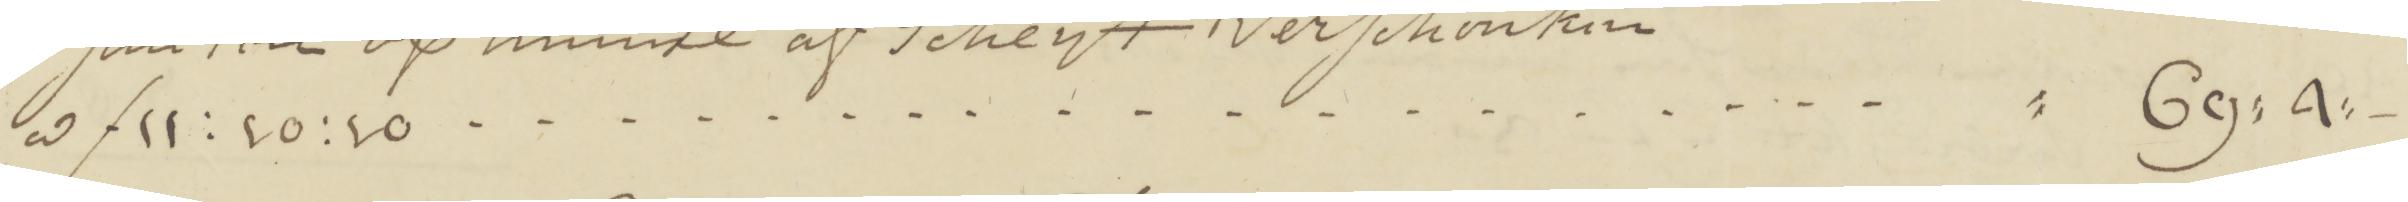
a ƒ11: 10: 10 - - - - - - - - - - - - - - - - - - - „ 69„4„-
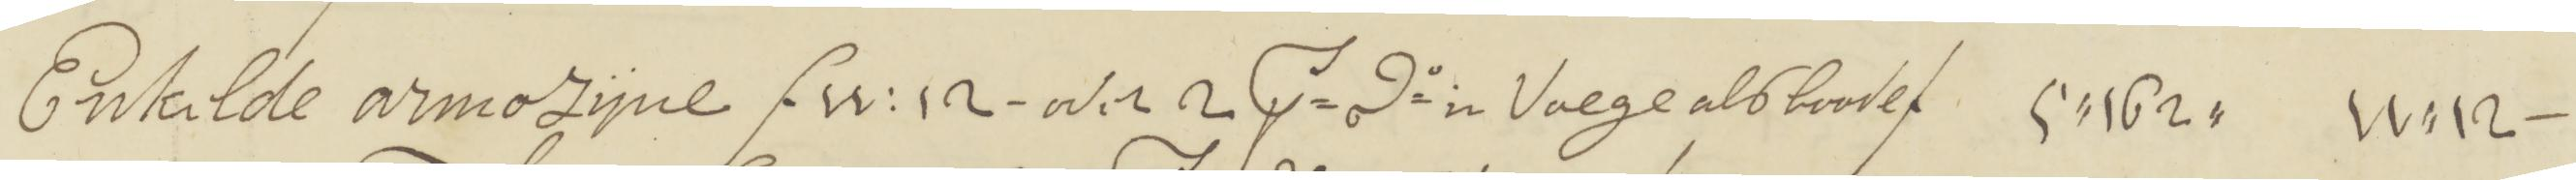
Enkelde armozijne ƒ 11-12 - over 2 p=s D=o in volge als boove ƒ 5„162„ 11„12—
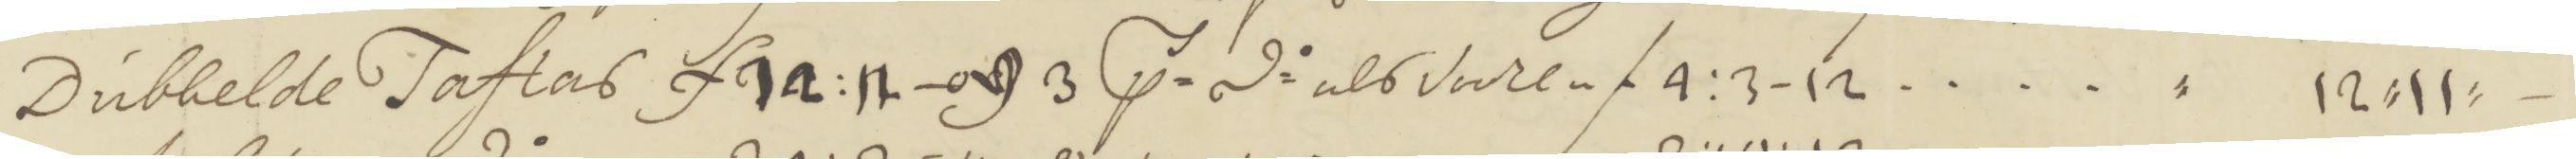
Dubbelde Taftas ƒ14:11-09 3 p=s d=o als voorl a ƒ4:3-12 . . . . „ 12„11„—
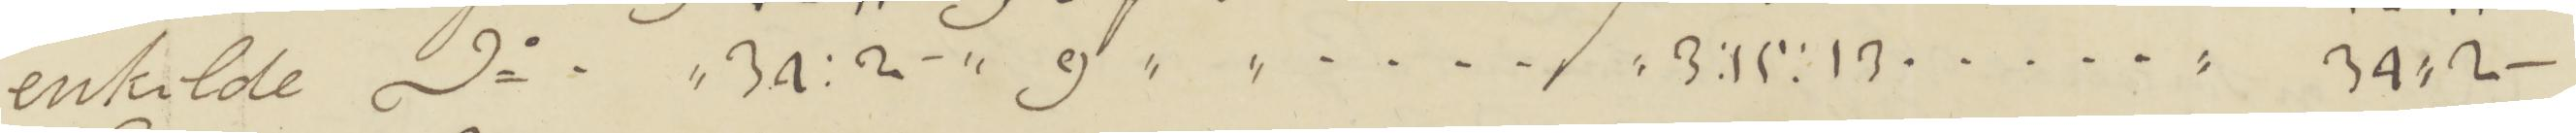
enkelde d=o - „ 34:2- „ 9 „ „ - . - - „ 3:15:13 . . . . . „ 34„ 2—
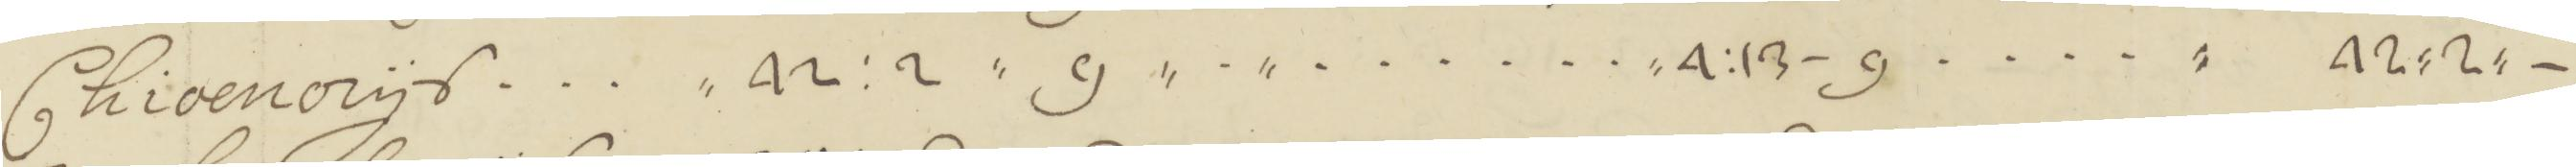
Chioenorijs . . . „ 42:2 „ 9 „ - „ . . . „ 4:13-9 . . . - „ 42„2„—
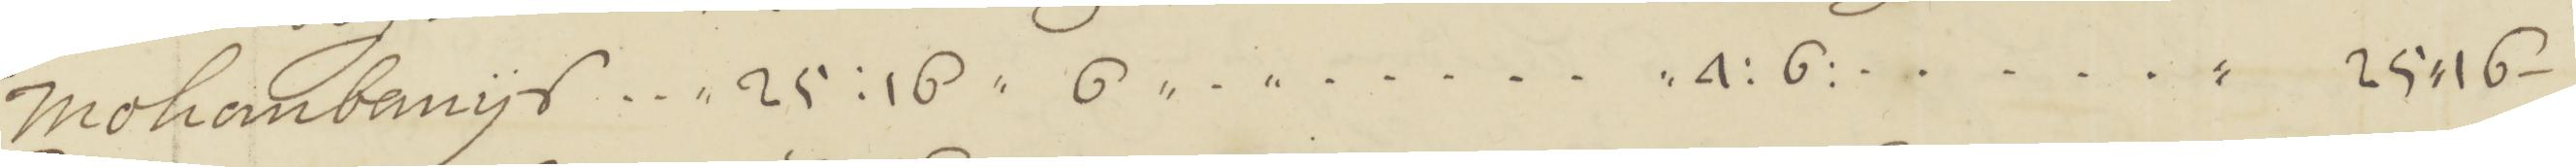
Mohanbanijs . . „ 25:16 „ 6 „ - „ . - - - - „ 4: 6: . - . . „ 25„16—
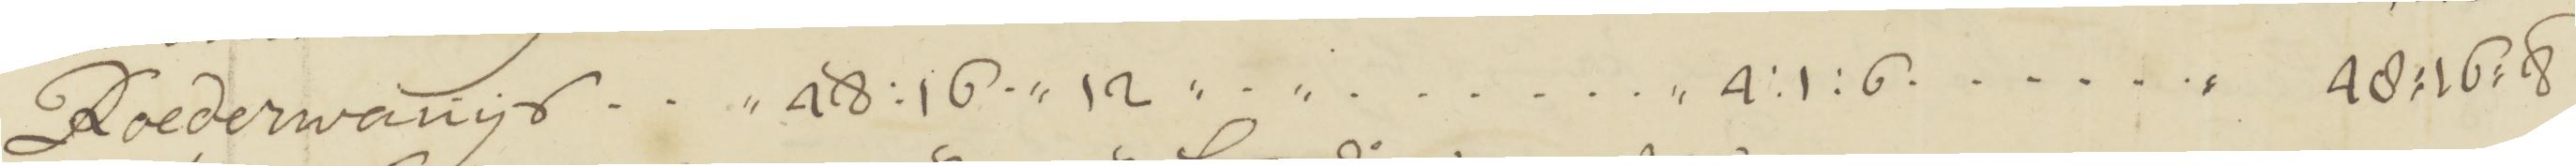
Roederwanijs . . „48:16. „ 12 „ - „ . . . - . . „ 4:1:6 . . - - - . „ 48„16„8
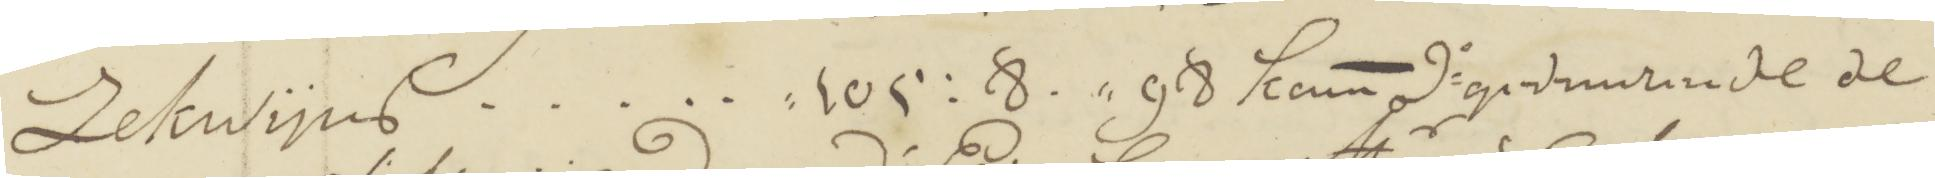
Zekwijns . . . . . „ 105: 8 . „ 98 kann d=o geduurende de
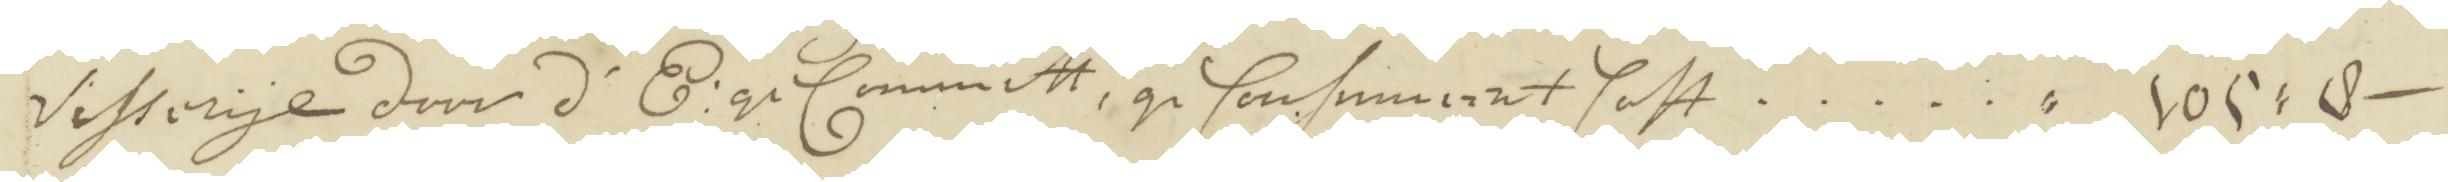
Visserije door d’ E: geCommitt,s geConsumeert Cost . . . . . „ 105„ 8—
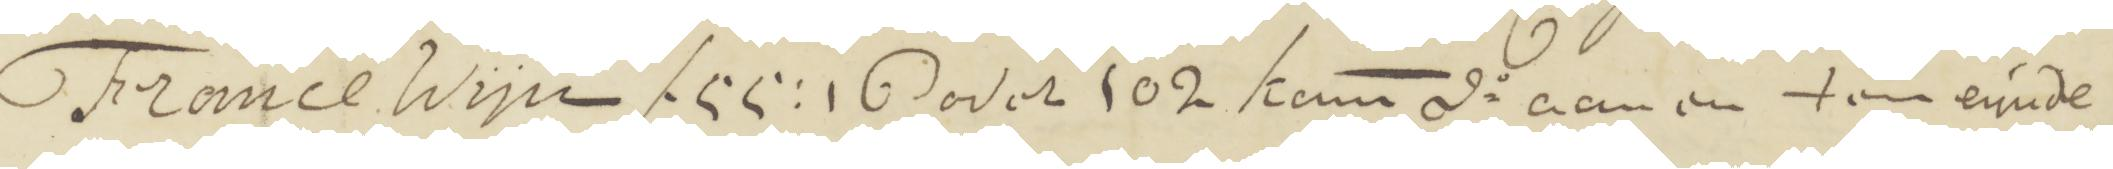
France wijn ƒ 55: 16 over 102 kann d=o aan en ten eijnde
